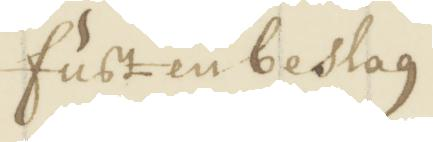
fusten beslag
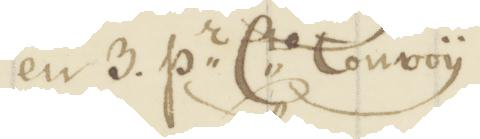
en 3. p„r C„to Convoij
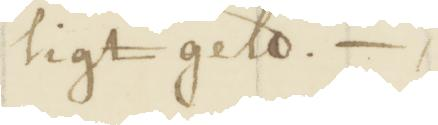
ligt geld.-
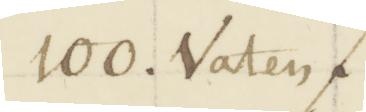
100. Vaten ƒ
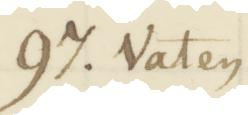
97. Vaten
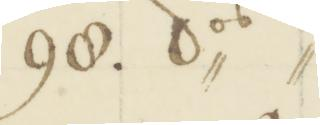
98. d„os „
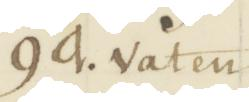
94. Vaten
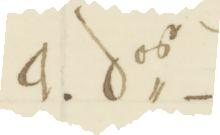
4. d„os
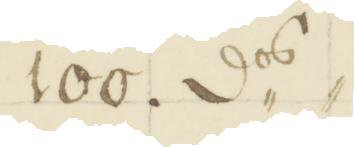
100. d„os
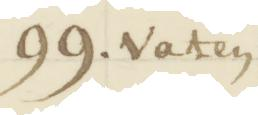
99. vaten
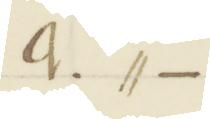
4. „ -
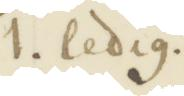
1. ledig.
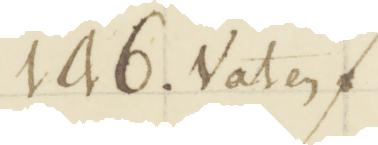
146. Vaten ƒ
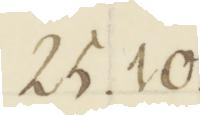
25.10.
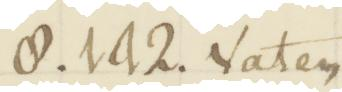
8. 142. Vaten
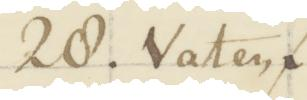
28. Vaten ƒ
